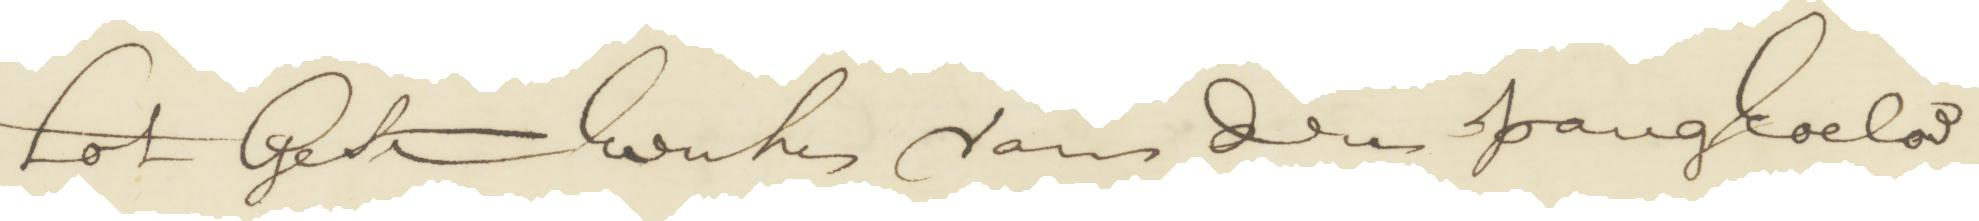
tot Geschenk van den panghoeloe
